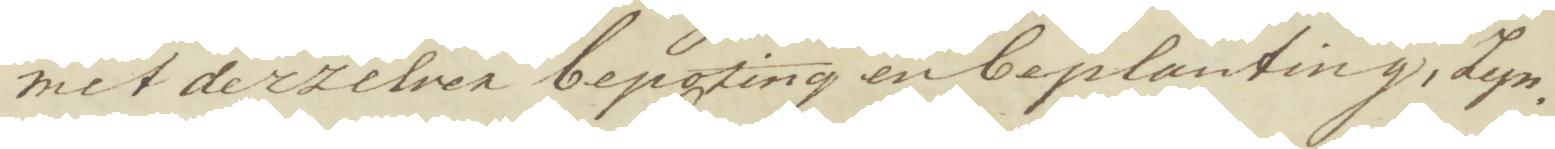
met derzelver bepoting en beplanting, Zyn,
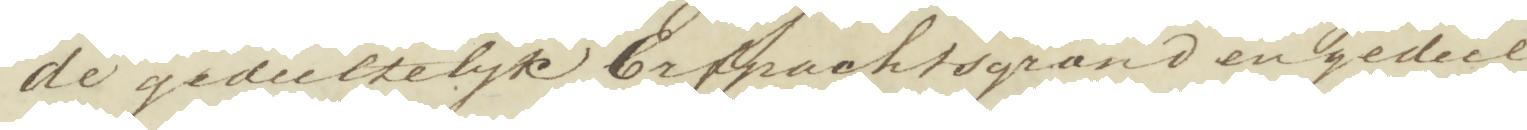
de gedeeltelyk Erfpachtsgrond en gedeel
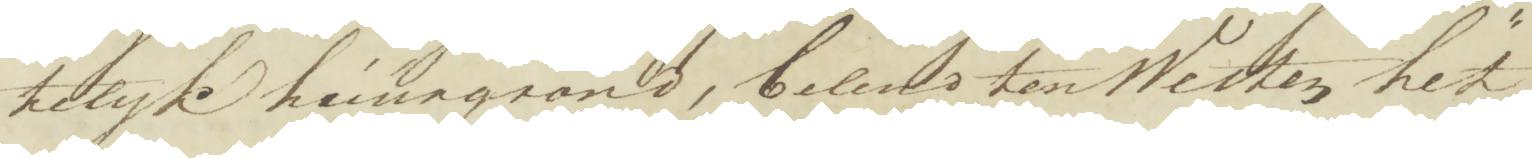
telyk huurgrond, belend ten westen het
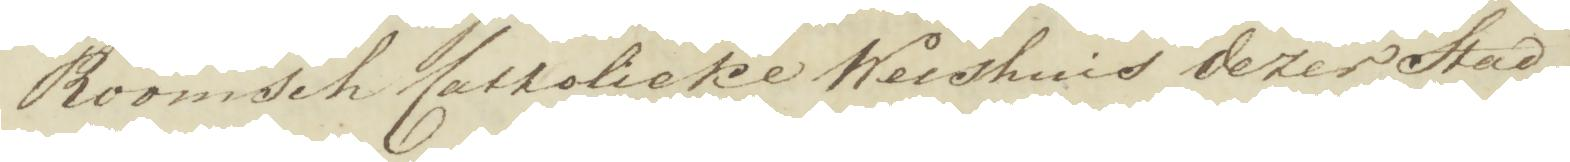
Roomsch Catholieke Weeshuis dezer Stad,
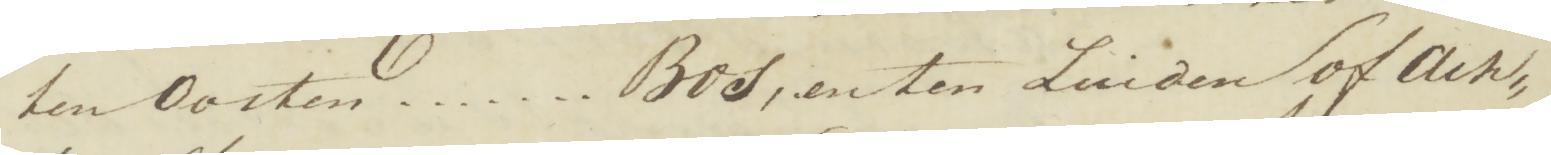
ten Oosten . . . . . . . Bos, en ten Zuiden of ach„
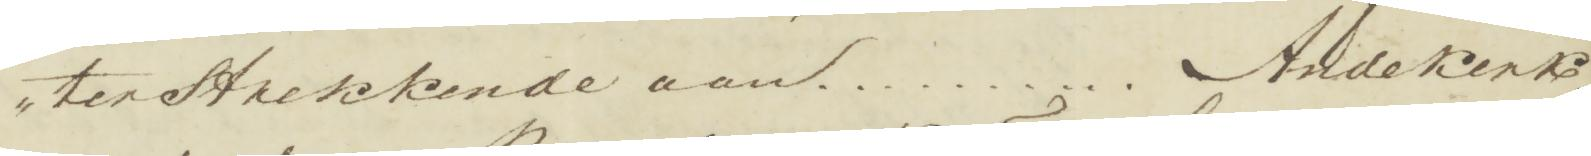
„terstrekkende aan . . . . . . . . . . Andekerk,
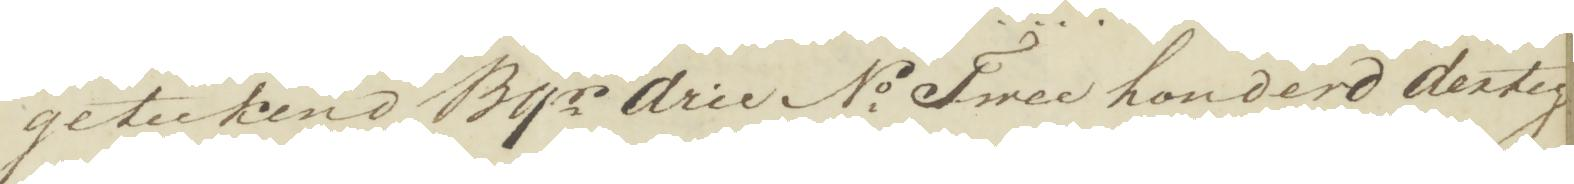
geteekend Bg=r drie N:o Twee honderd dertig
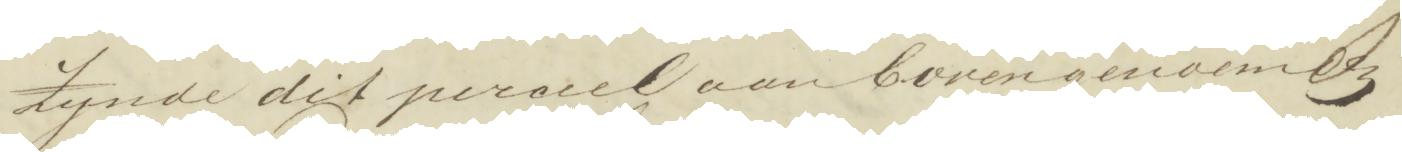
Zijnde dit perceel aan boven genoemde
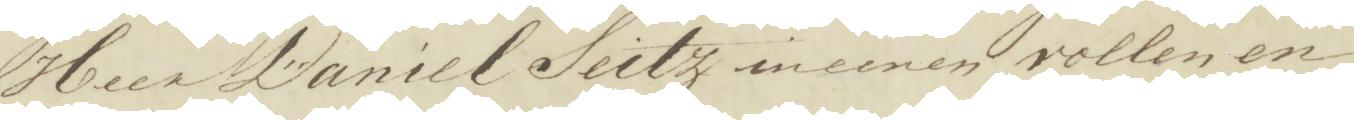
Heer Daniel Seitz in eenen vollen en
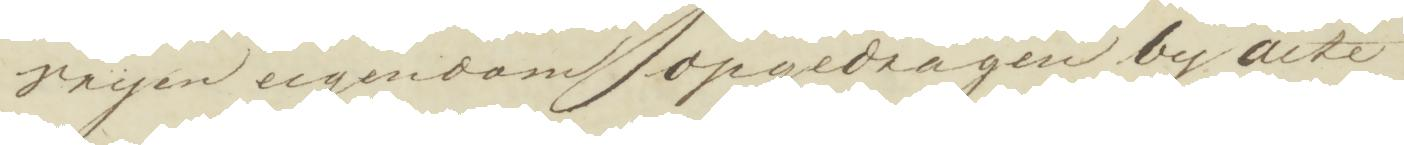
vrijen eigendom opgedragen by acte
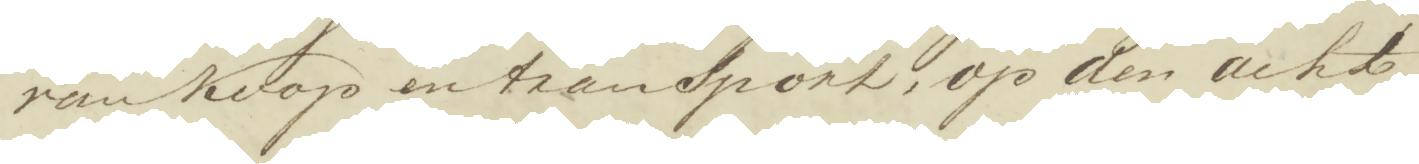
van koop en transport, op den acht
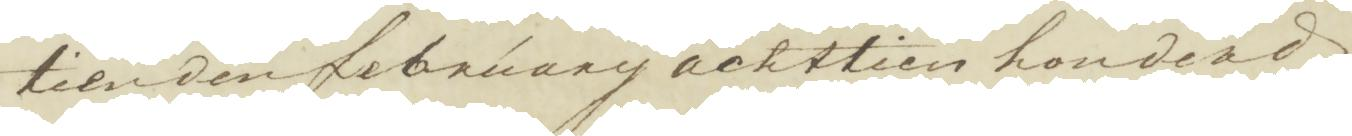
tien den february achttien honderd
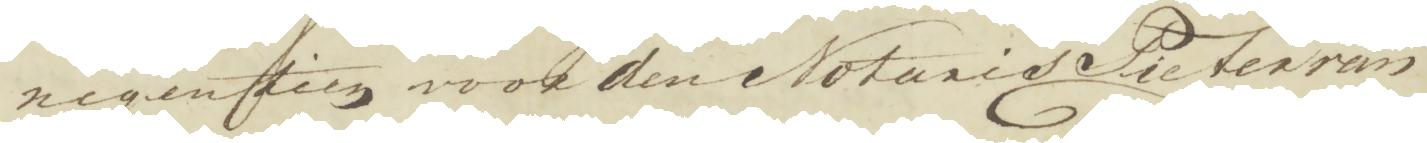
negentien voor den Notaris Pieter van
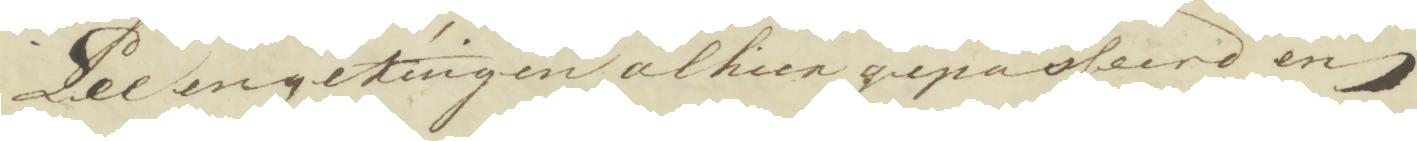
Lee en getuigen alhier gepasseerd en
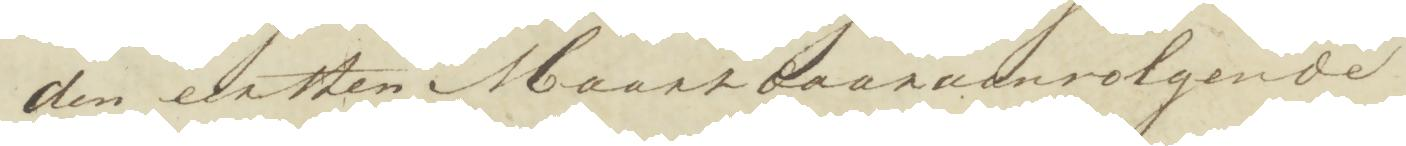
den eersten Maart daar aanvolgende
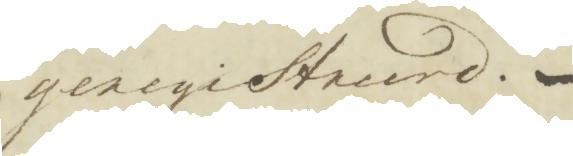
geregistreerd.—
